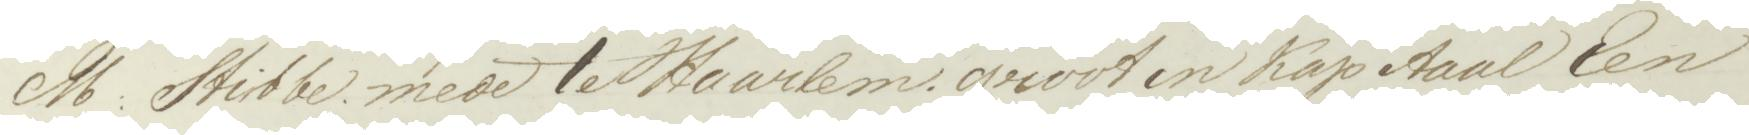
M: Stibbe mede te Haarlem. groot in kapitaal Een
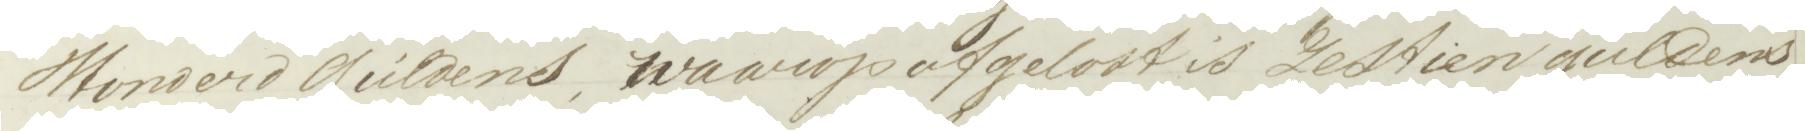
Honderd Guldens, waarop of gelost is Zestien guldens
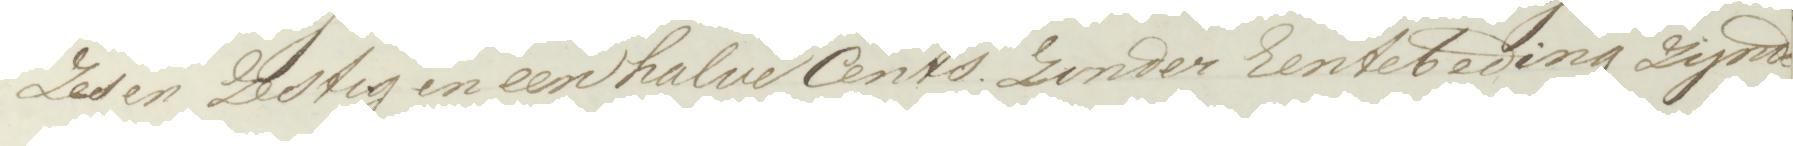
zes en zestig en een halve Cents zonder rentebeding zijnd
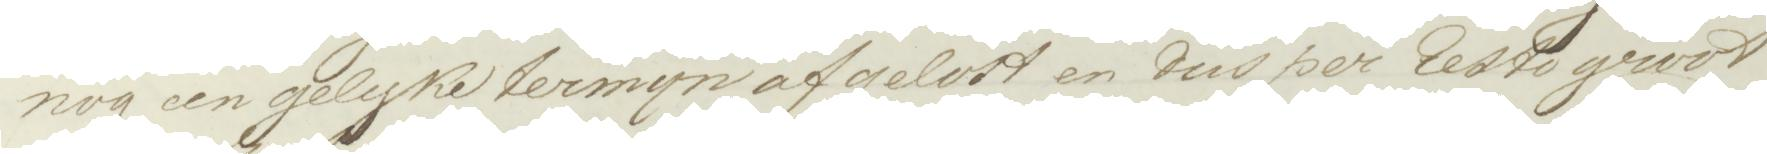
nog een gelyke termijn af gelost en dus per resto groot
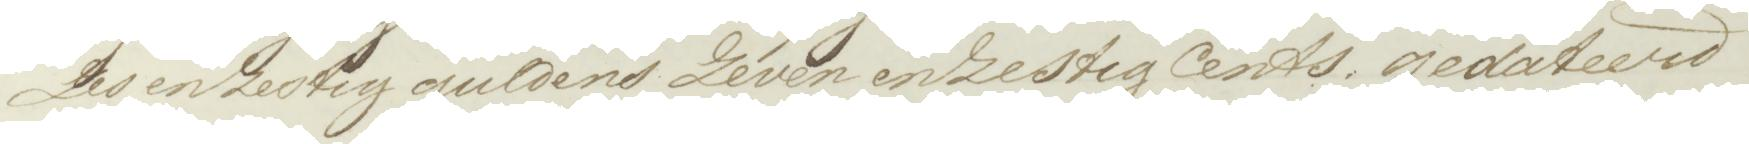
zes en zestig guldens zeven en zestig Cents. gedateerd
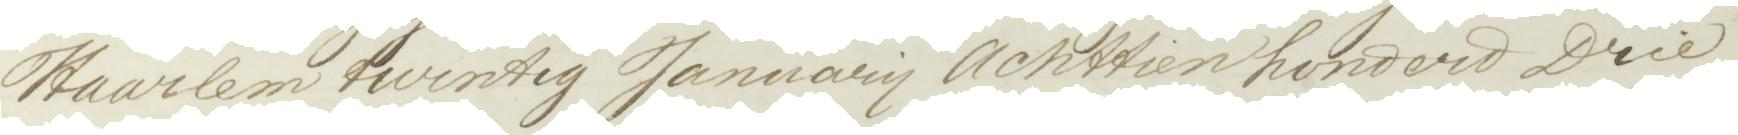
Haarlem twintig Januarij Achttien honderd Drie
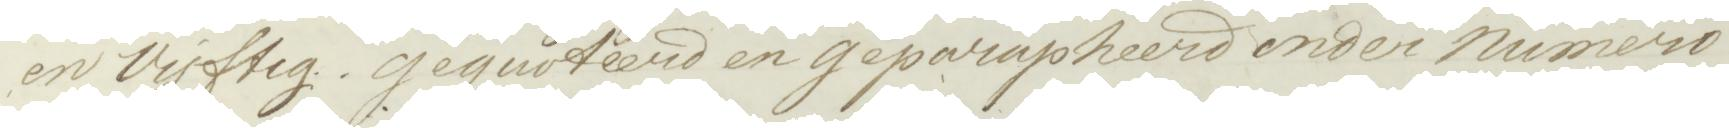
en Vijftig. gequoteerd en geparapheerd onder numero
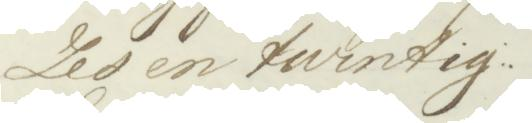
zes en twintig..
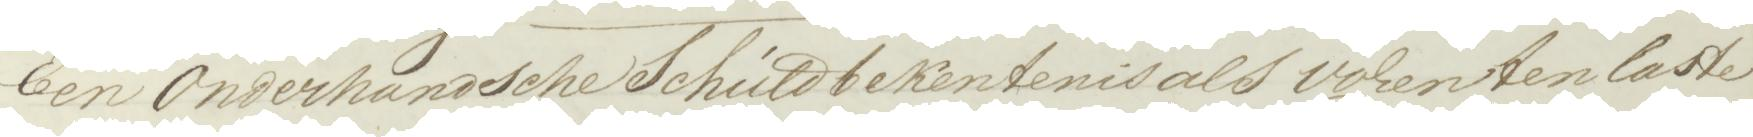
Een Onderhandsche schuld bekentenis als voren ten laste
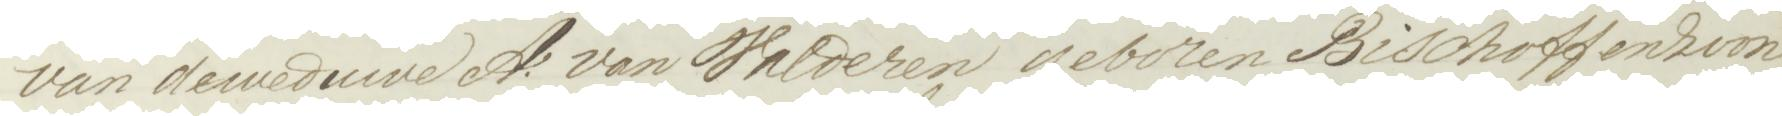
van de weduwe A. van Valderen geboren Bischoff en zoon
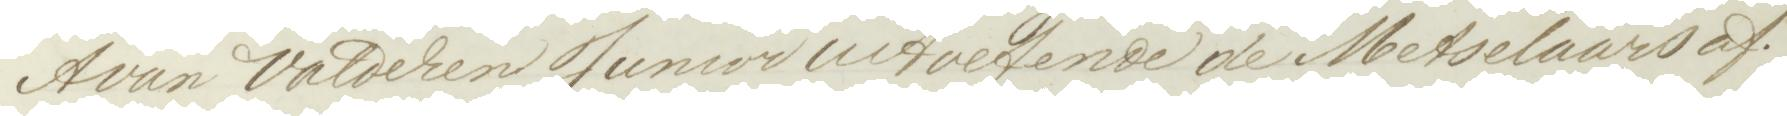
A van Valderen Junior uitoefende de Metselaars af.
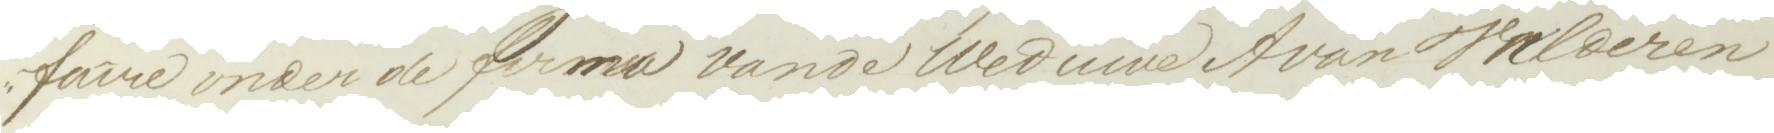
„faire onder de firma van de Weduwe A van Valderen
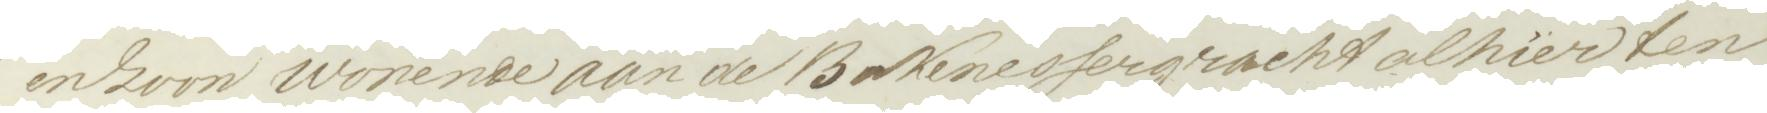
en zoon wonende aan de Bakenessergracht alhier ten
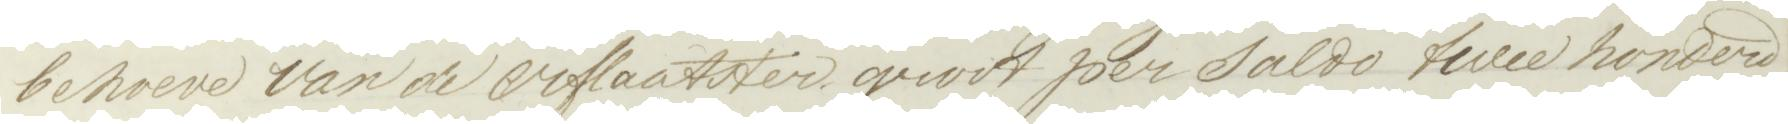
behoeve van de erflaatster groot per saldo twee honderd
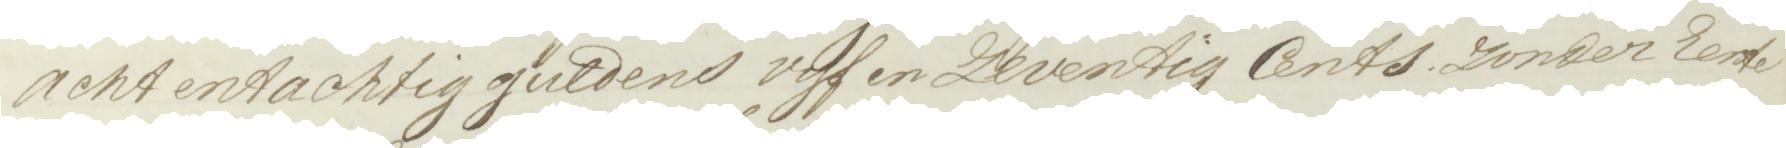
acht en tachtig guldens vyf en zeventig Cents, zonder Rente
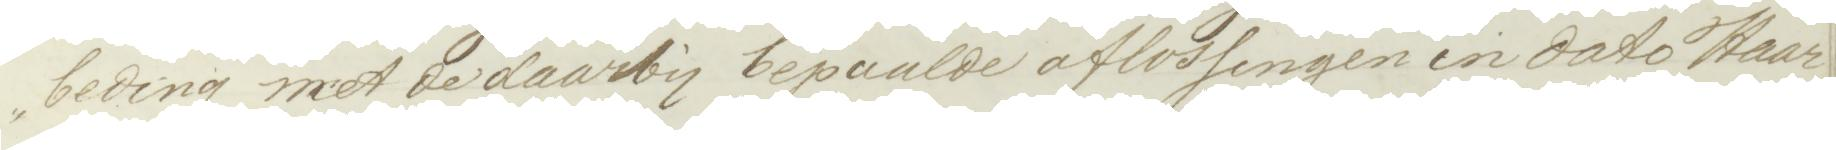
„beding met de daarbij bepaalde aflossingen in dato Haar
